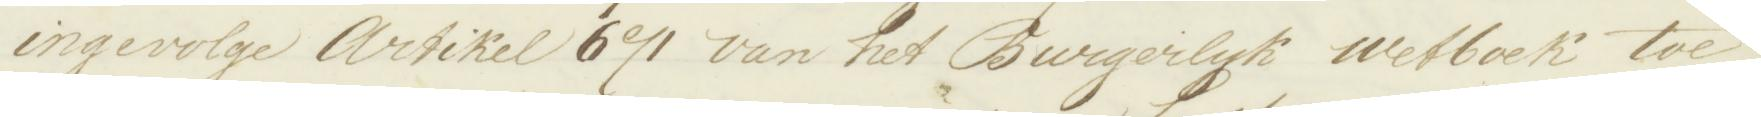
ingevolge Artikel 671 van het Burgerlyk wetboek toe
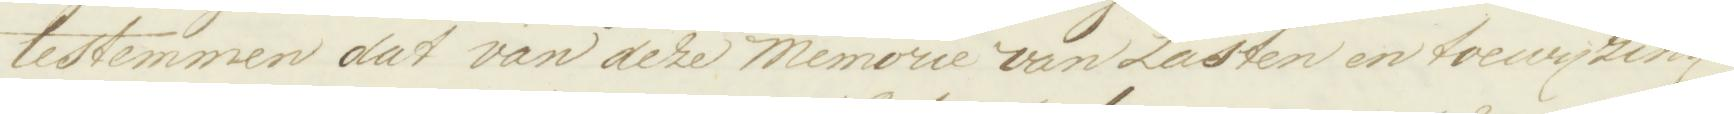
testemmen dat van deze Memorie van Lasten en toewyzing
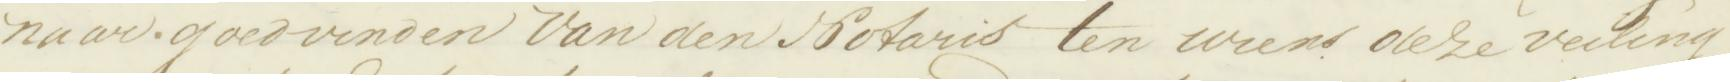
naar goedvinden van den Notaris ten wiens deze veiling
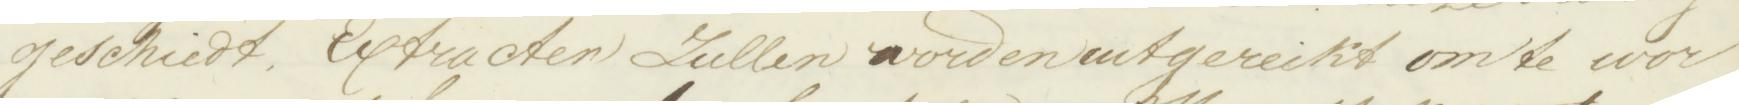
geschiedt, Extracten zullen worden uitgereikt om te wor
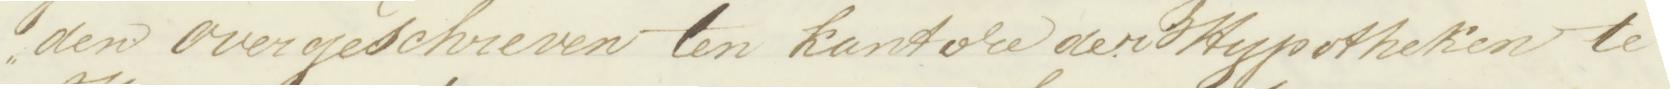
„den overgeschreven ten kantore der Hypotheken te
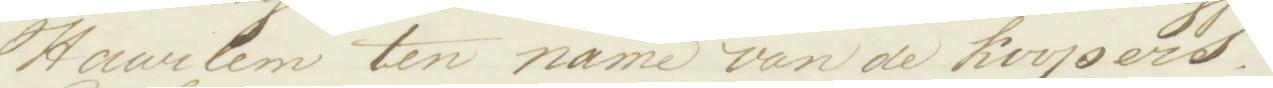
Haarlem ten name van de koopers.
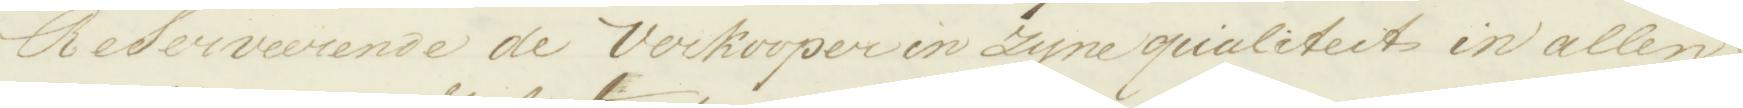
Reserveerende de Verkooper in zyne qualiteit in allen
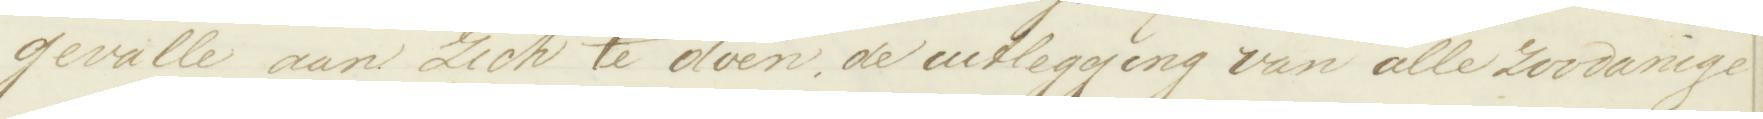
gevalle aan zich te doen, de uitlegging van alle zoodanige
